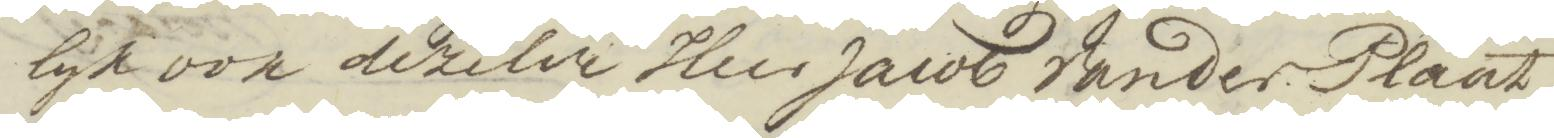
lyk ook dezelve Heer Jacob vander Plaat
